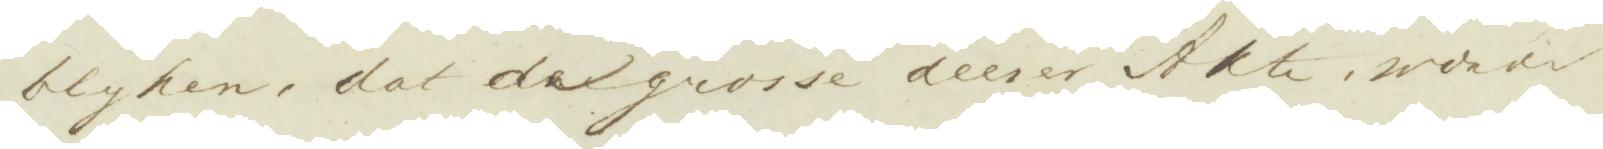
blyken, dat de grosse deeser Akte, worde
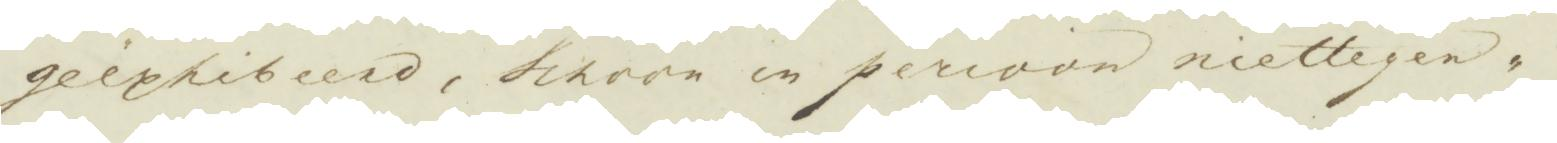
geëxhibeerd, Schoon in persoon niettegen„
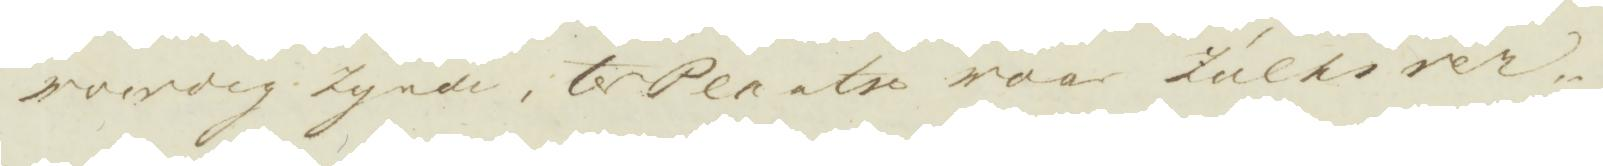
woordig zynde, ter Plaatse waar zulks ver„
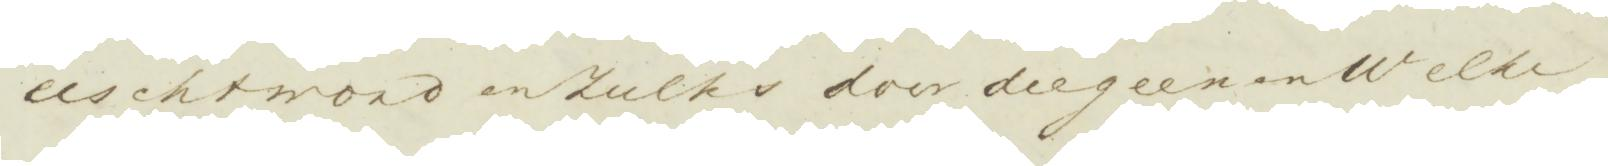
eischt word en zulks door diegeenen Welke
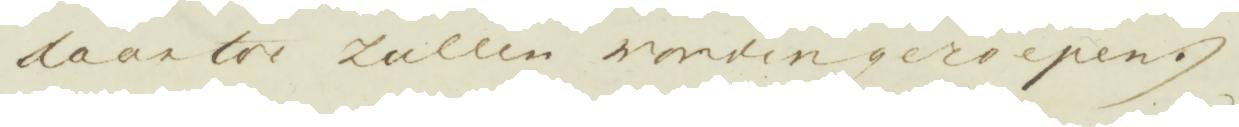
daar tot zullen worden geroepen.
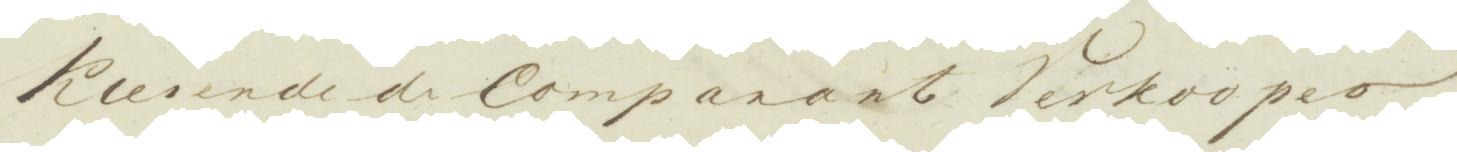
Kiesende de Comparant Verkooper
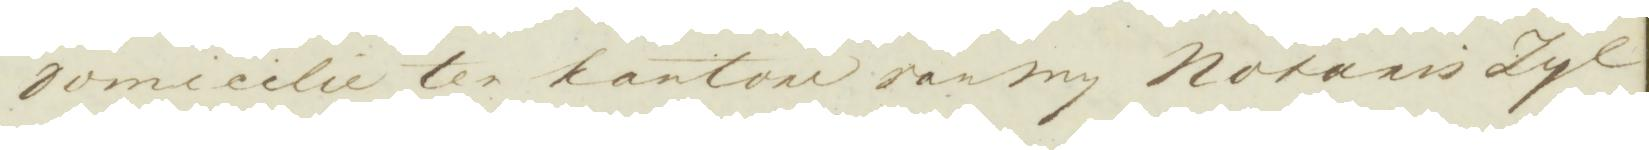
domicilie ter kantore van my Notaris Zyl
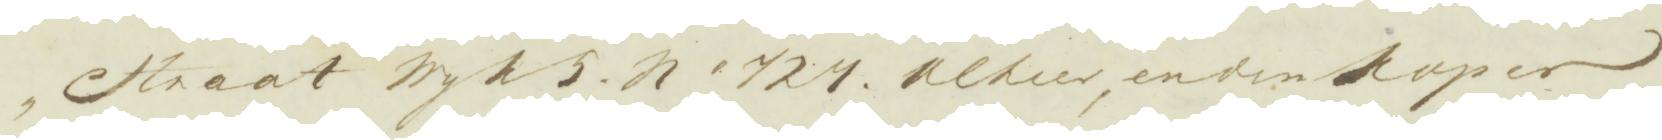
„Straat Wyk 5. N:o 727. Alhier, en den koper
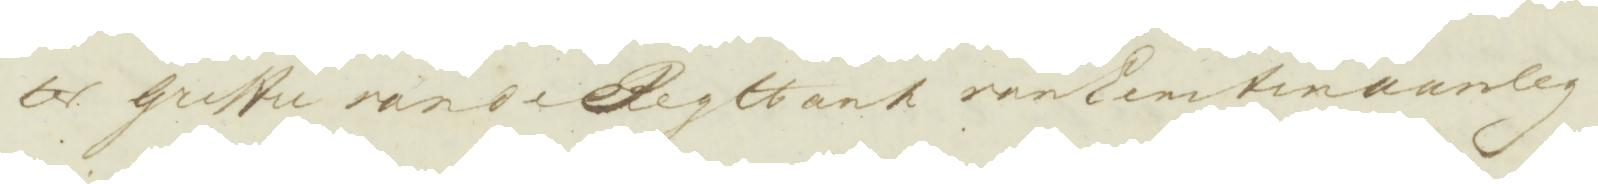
ter griffie van de Regtbant van Eerstenaanleg
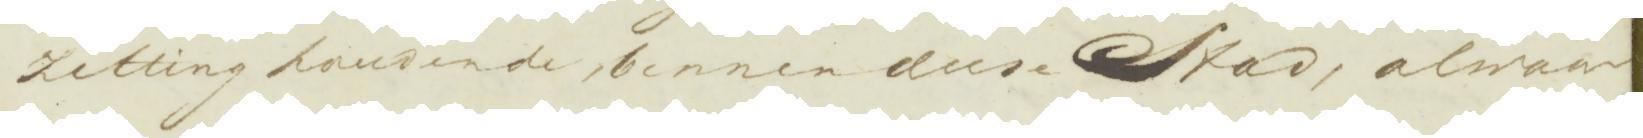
zitting houdende, binnen deese Stad, alwaar
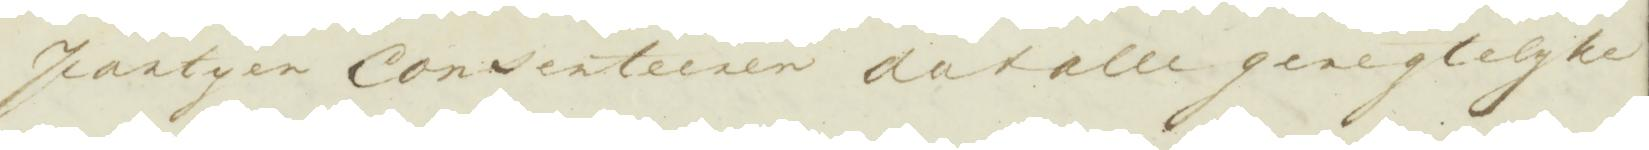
partyen Consenteeren dat alle geregtelyke
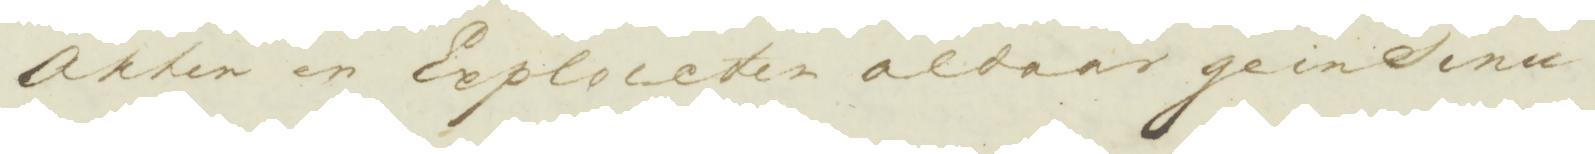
akten en Exploicten aldaar geinsinu
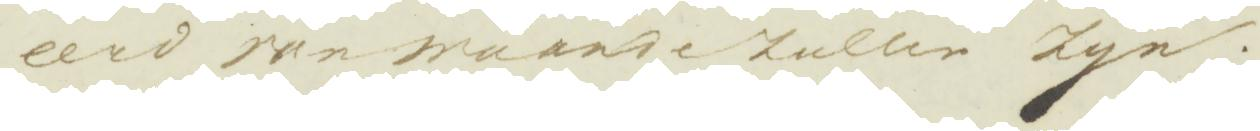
eerd van waarde zullen zyn.
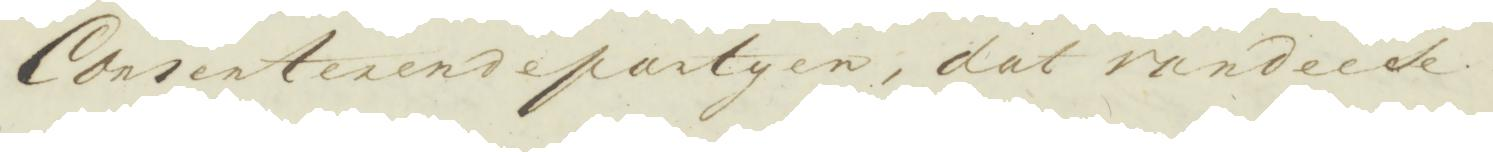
Consenterende partyen, dat van deese
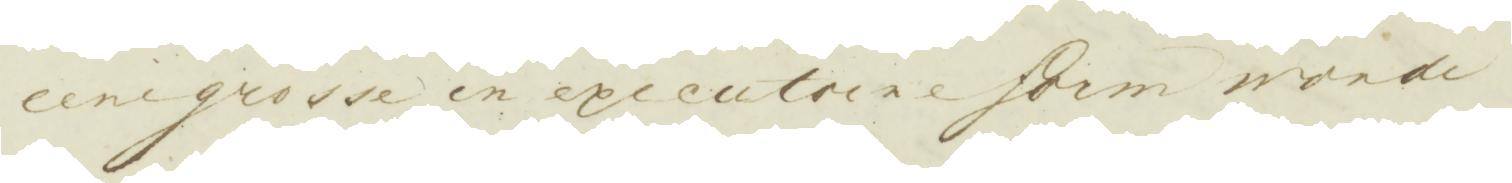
eene grosse in executoire form worde
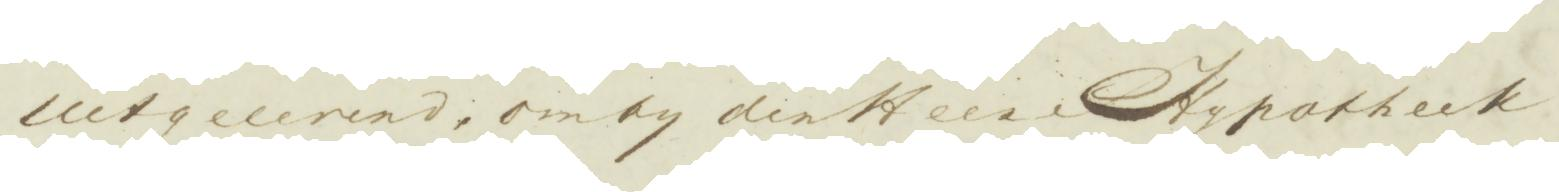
uitgeleverd; om by den Heer Hypotheek
